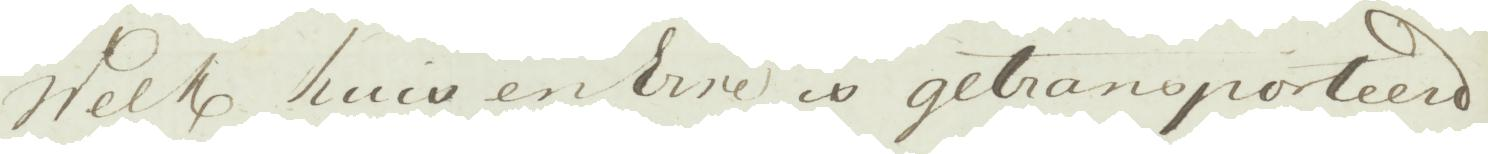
Welk huis en Erve is getransporteerd
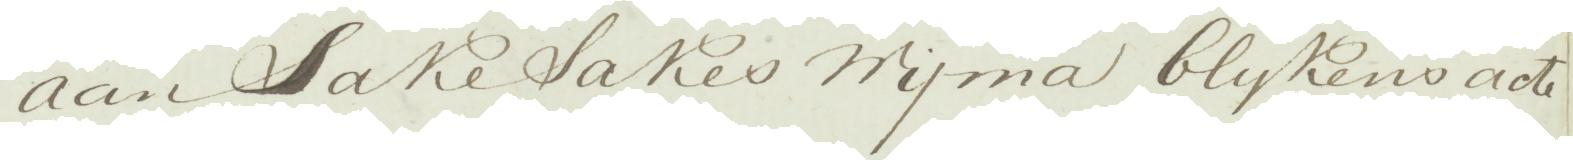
aan Sake Sakes Wijma blykens acte
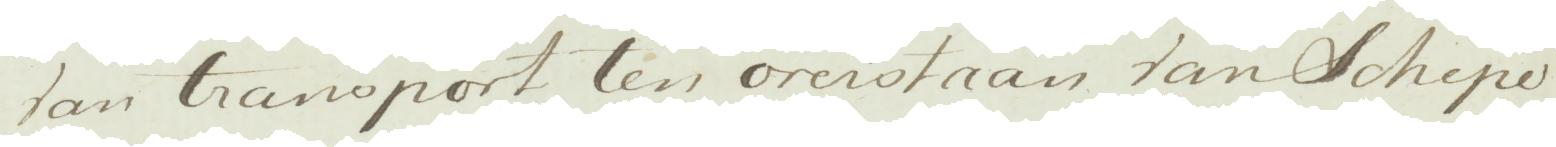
van transport ten overstaan van Schepe
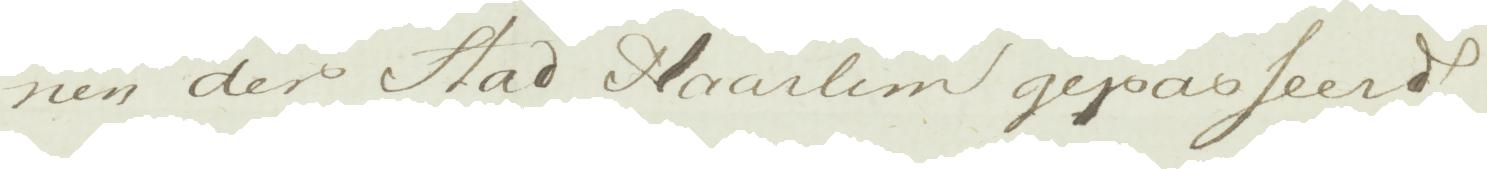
nen der Stad Haarlem gepasseerd
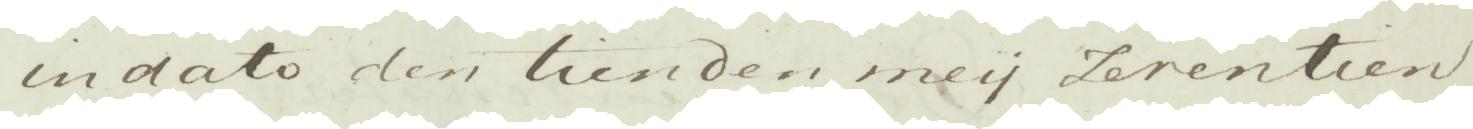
in dato den tienden meij zeventien
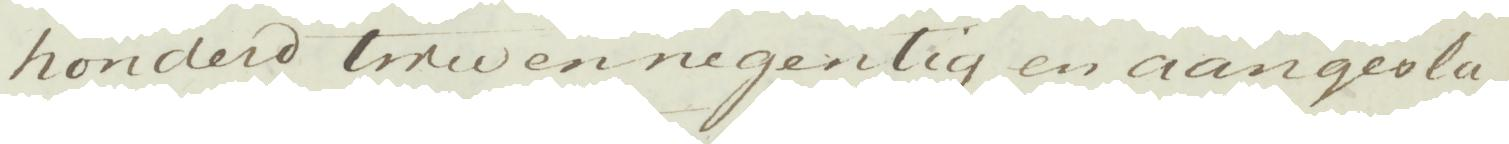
honderd twee en negentig en aangesla
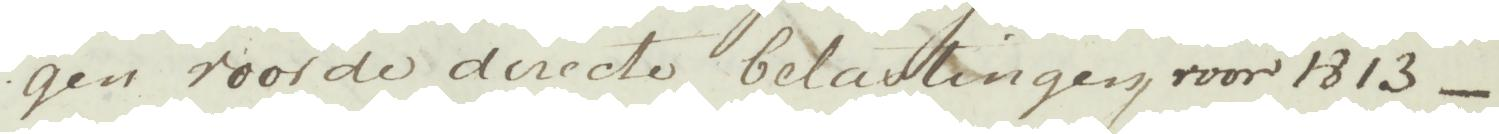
gen voorde directe belastingen, voor 1813 _
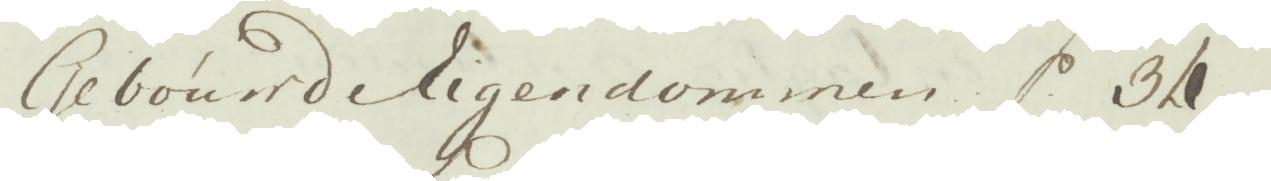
Gebouwde Eigendommen. ƒ. 34
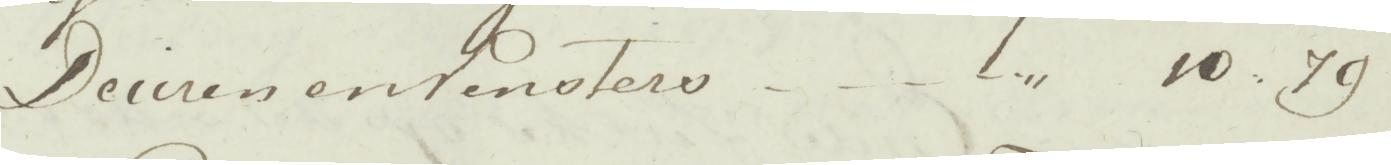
Deuren en vensters - - - „ 10:79
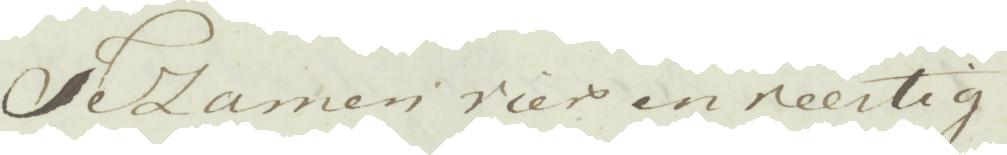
Tezamen vier en veertig
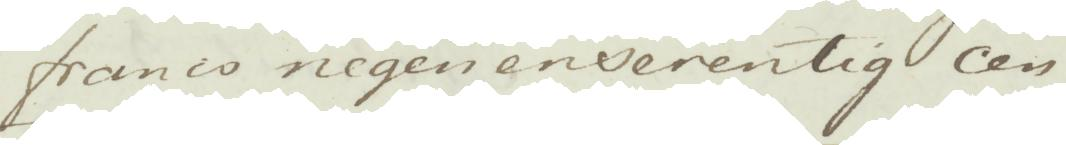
francs negen en seventig cen
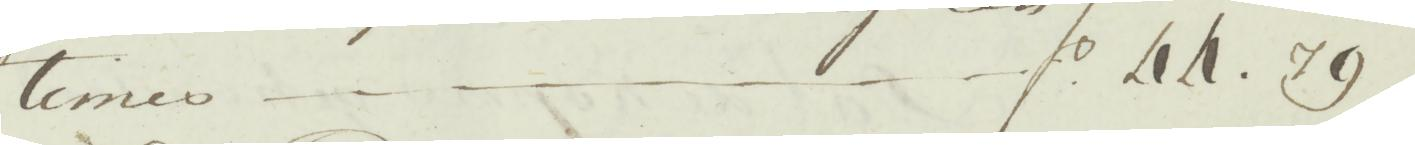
times ƒ. 44.79
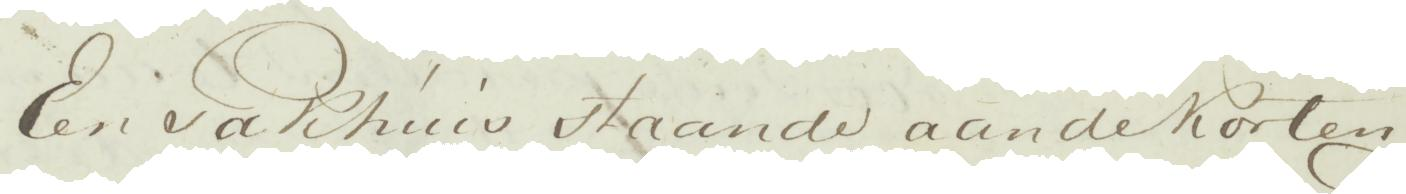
Een Pakhuis staande aan de Korten
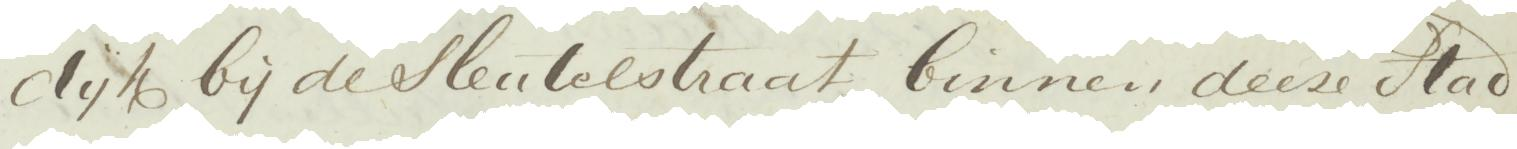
dijk bij de sleutelstraat binnen deese stad
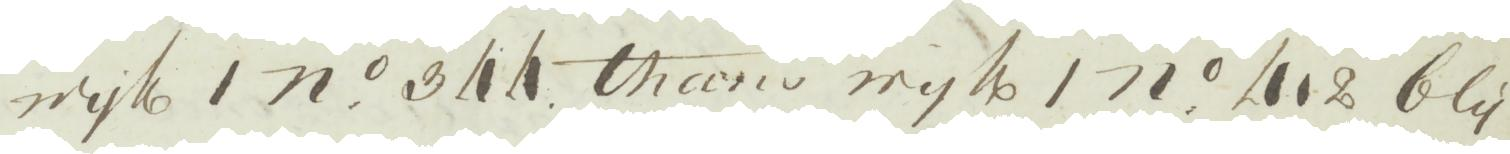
wijk 1 n.o 344. thans wijk 1 N.o 412 blij
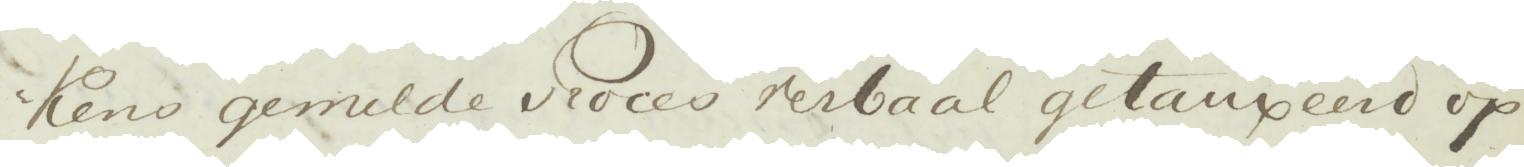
kens gemelde Proces verbaal getauxeerd op
